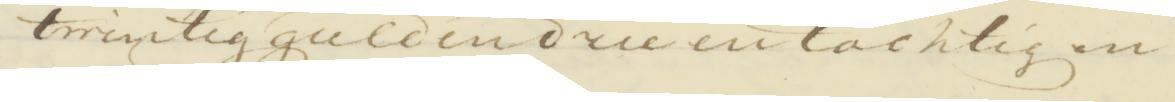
twintig gulden drie en tachtig en
